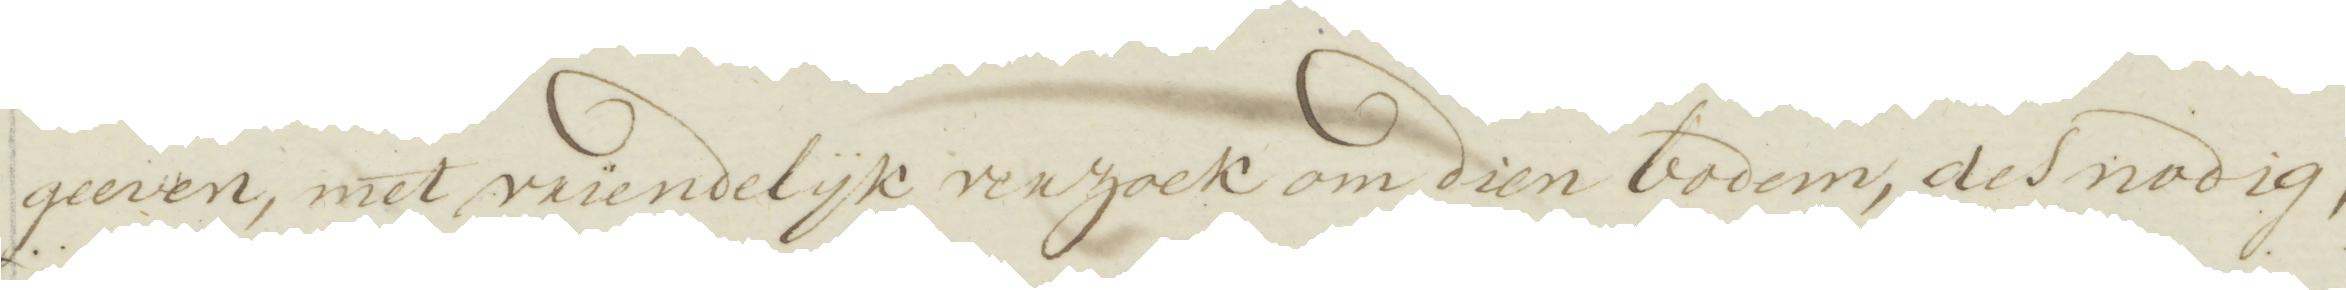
geeven, met vriendelijk verzoek om dien bodem, des nodig
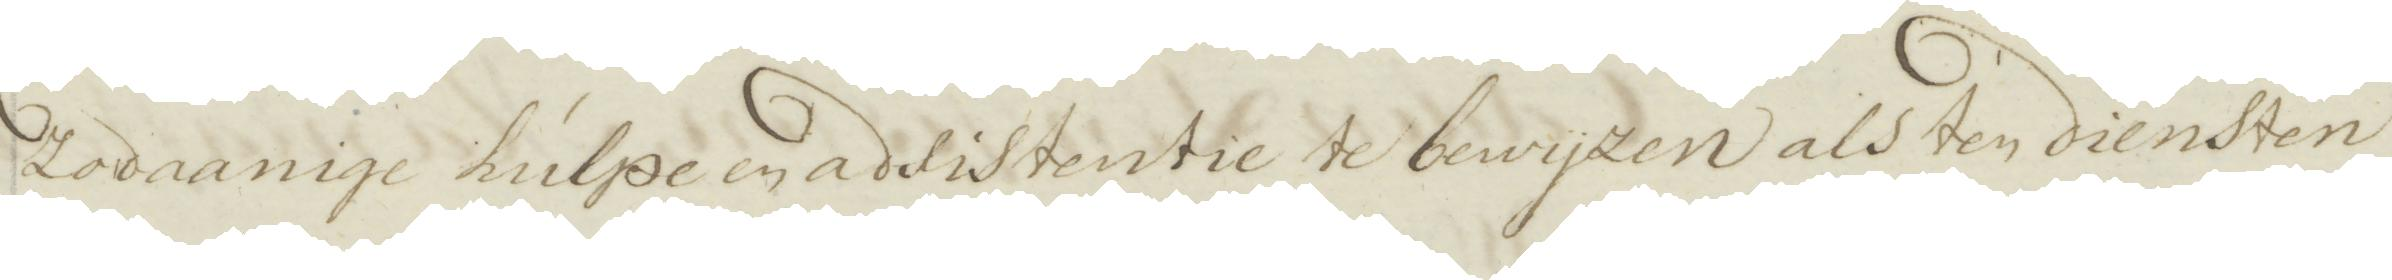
zodaanige hulpe en adsistentie te bewijzen als ten diensten
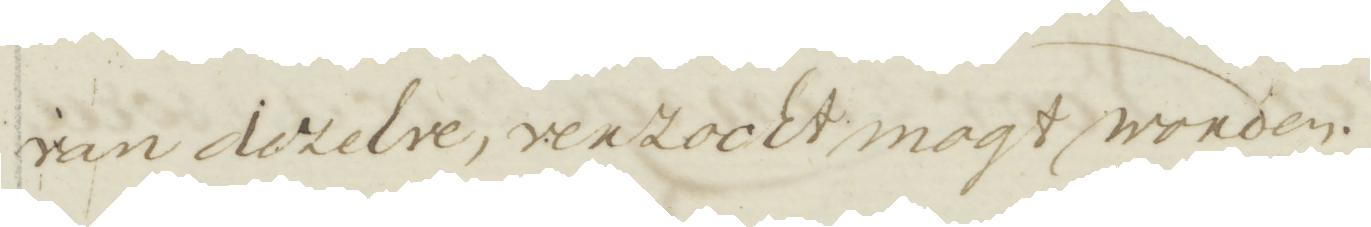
van dezelve, verzocht mogt worden.
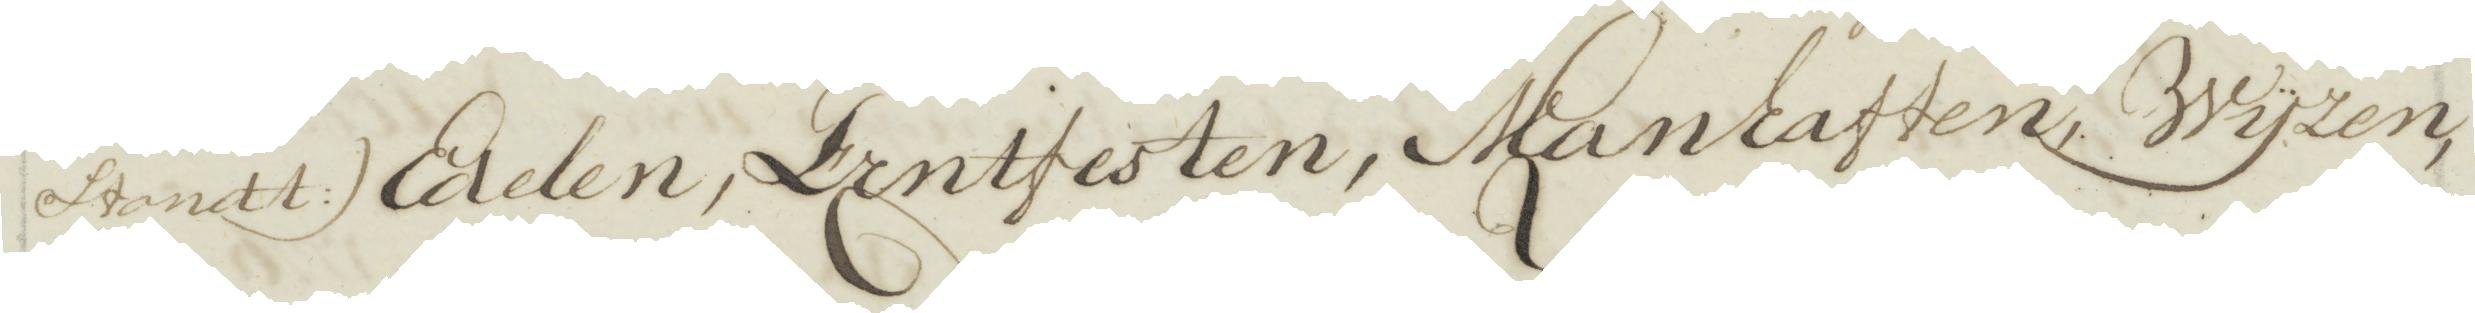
stondt:) Edelen, Erntfesten, Manhaften, Wijzen,
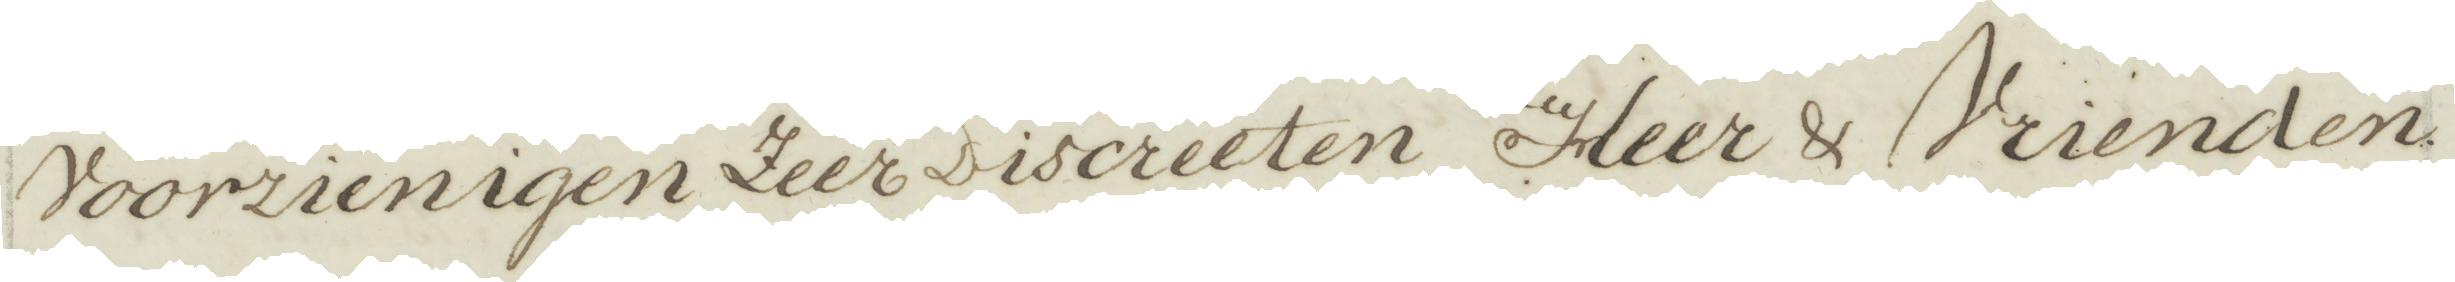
voorzienigen zeer Discreeten Heer & Vrienden
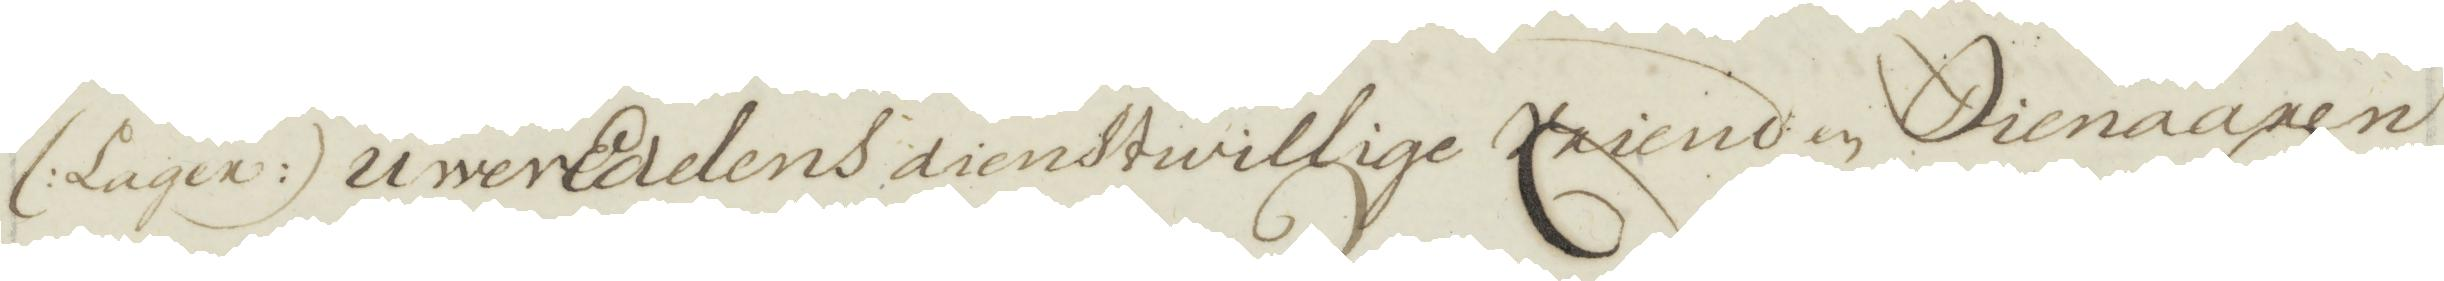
(:Lager:) uwer Edelens dienstwillige vriend en Dienaaren
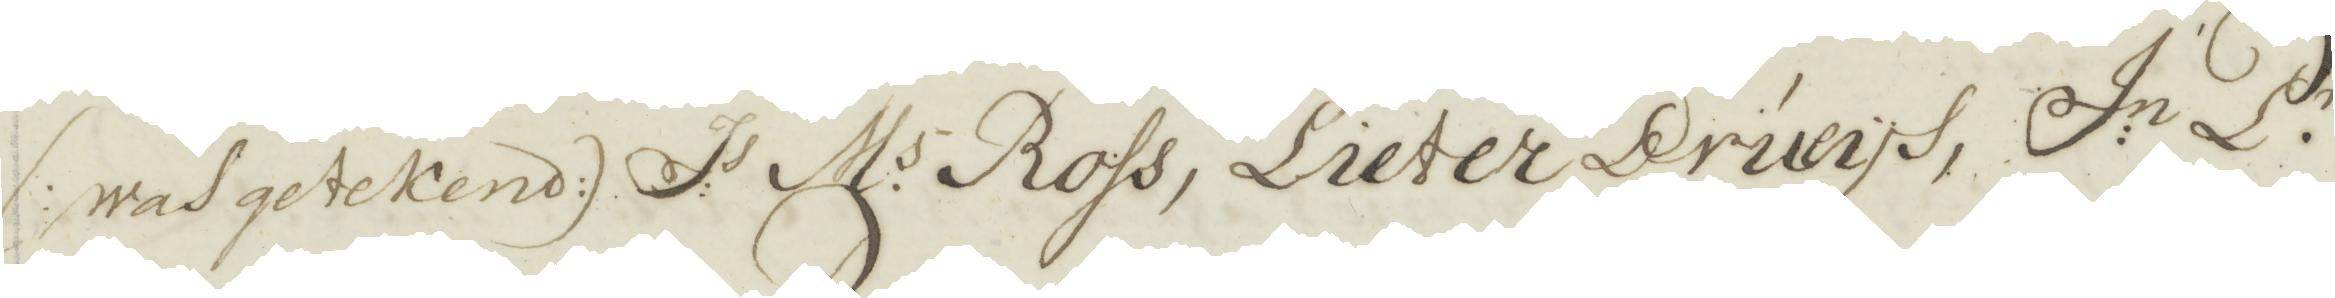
(:was getekend:) J:s M.s Ross, Pieter Brueijs, J:n P.r
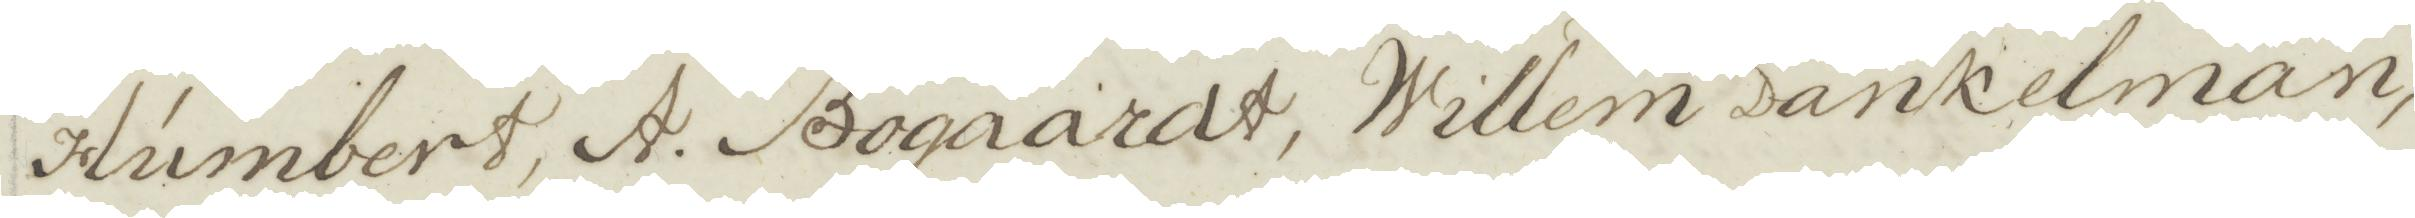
Humbert, A. Bogaardt, Willem Dankelman,
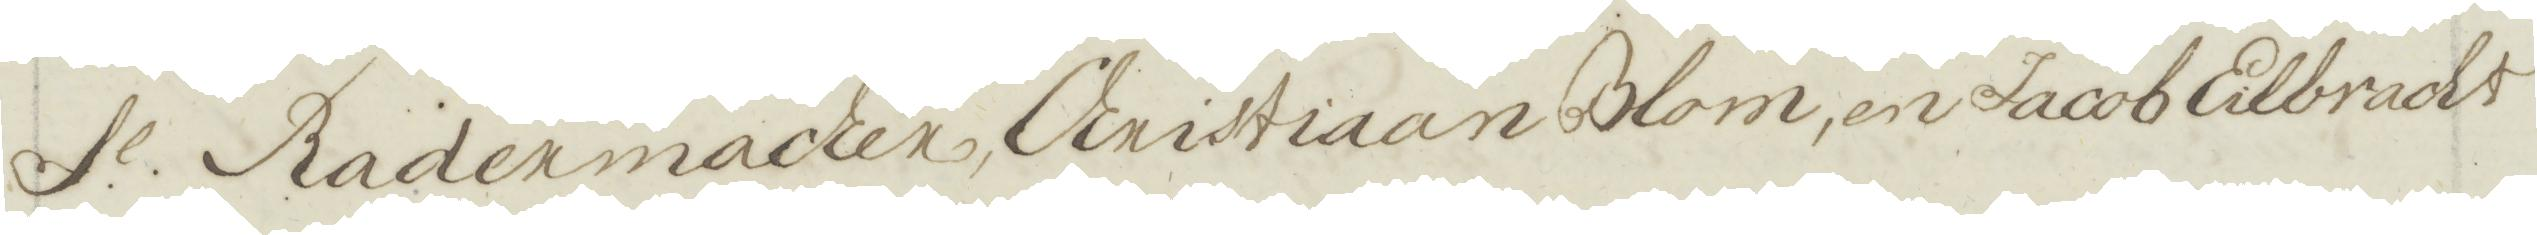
S.l Radermacker, Christiaan Blom, en Jacob Eilbracht
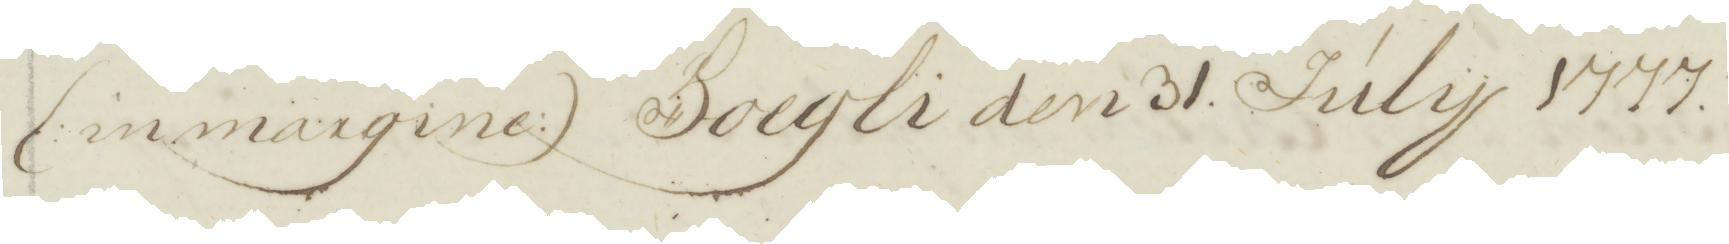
(:in margine:) Boegli den 31. Julij 1777.
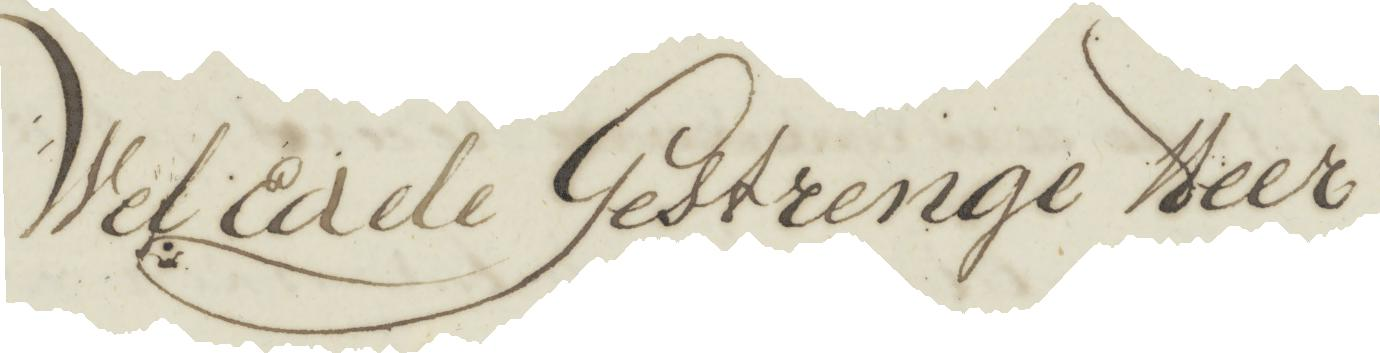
Wel Edele Gestrenge Heer
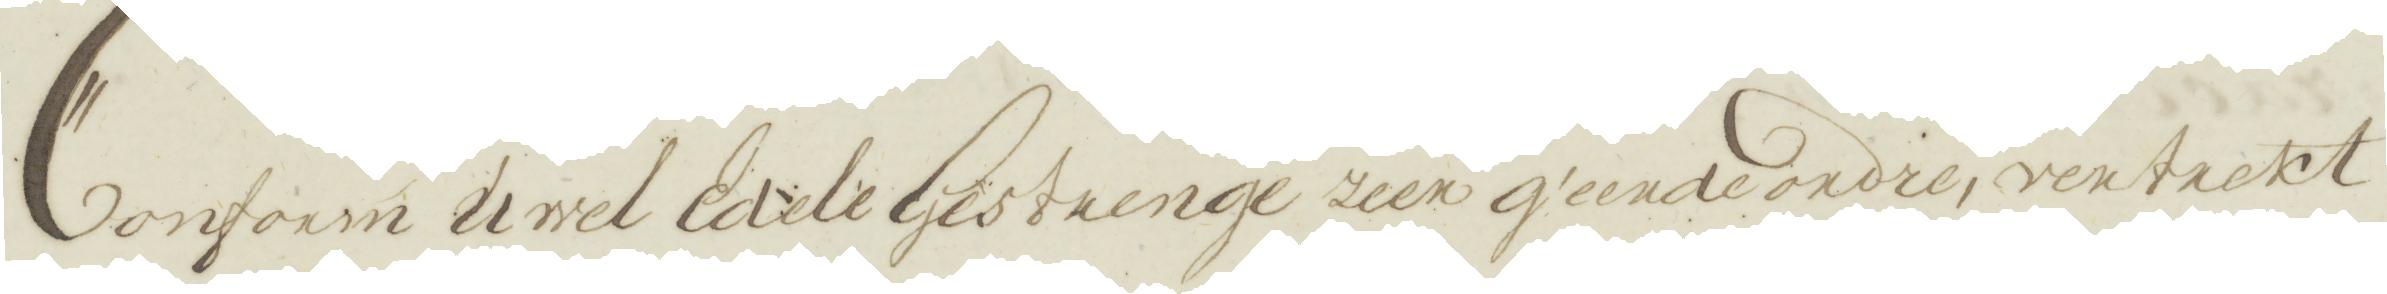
Conform u wel Edele Gestrenge zeer g’eerde ordre, vertrekt
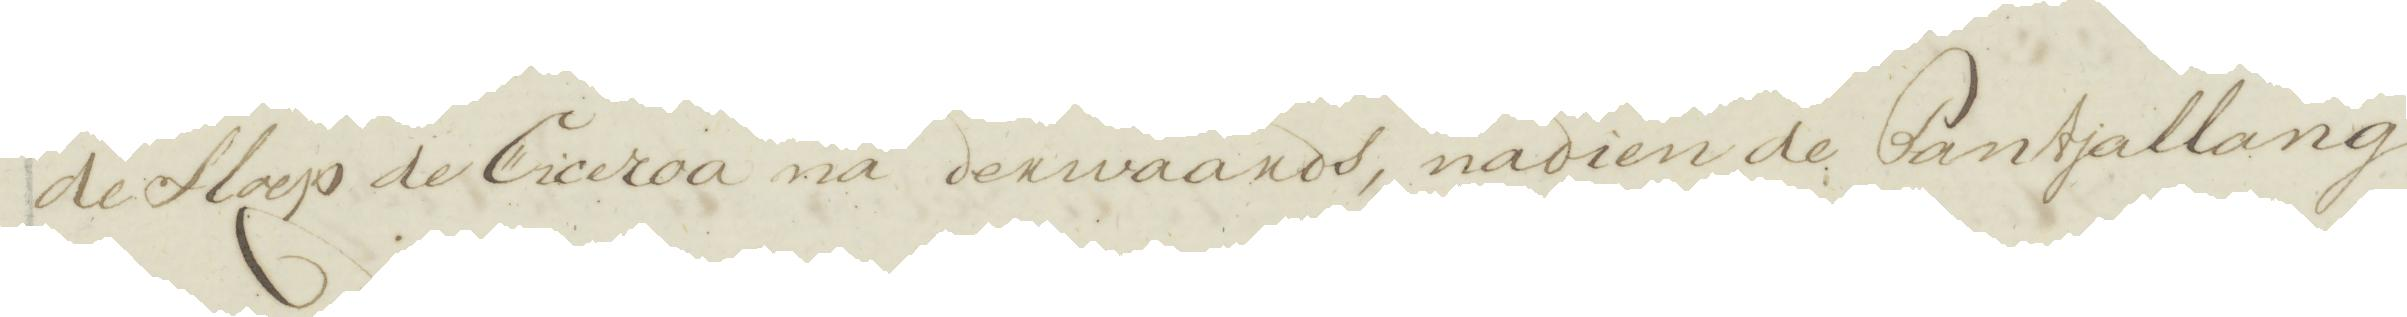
de sloep de Ciceroa na derwaards, nadien de Pantjallang
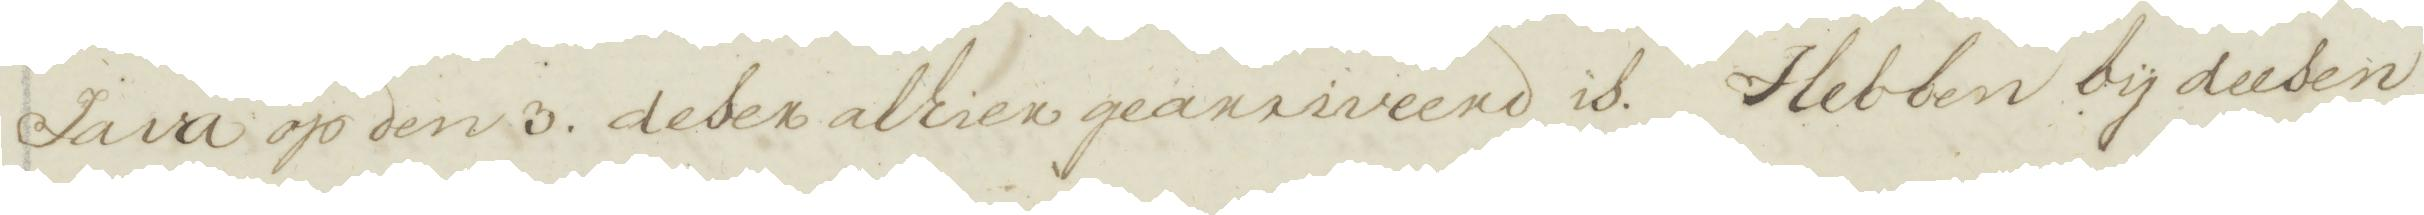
Java op den 3. deser alhier gearriveerd is. Hebben bij deesen
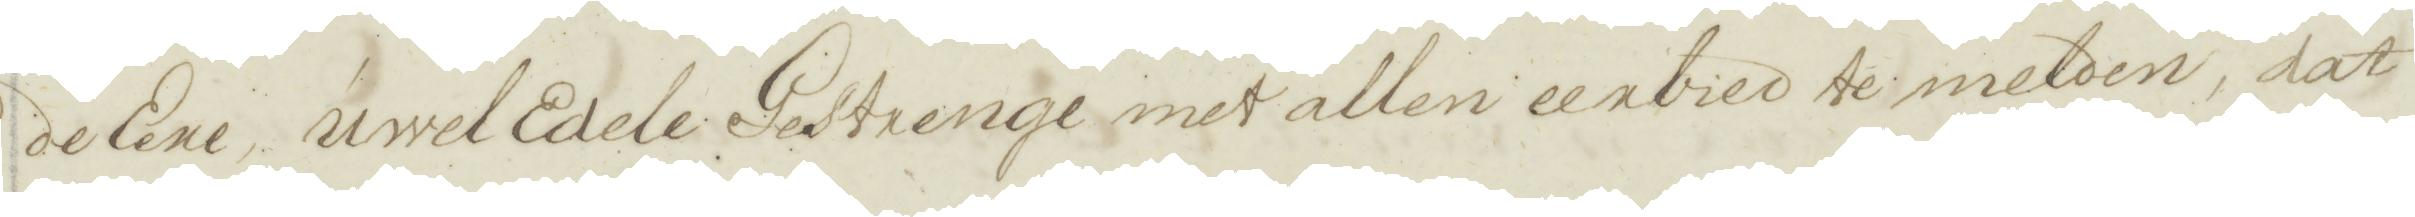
de Eere, u wel Edele Gestrenge met allen eerbied te melden, dat
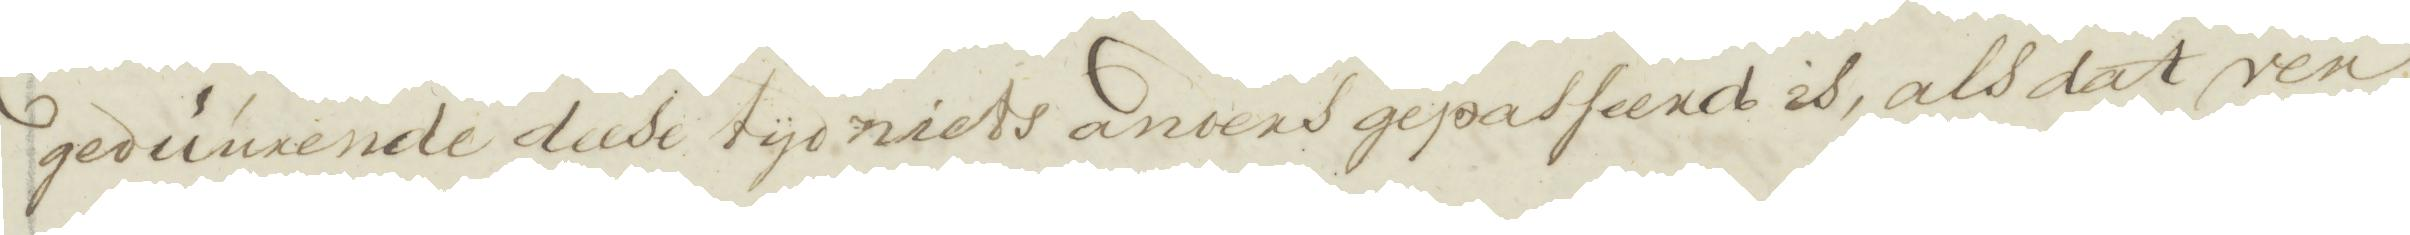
geduurende dese tijd niets anders gepasseerd is, als dat ver
